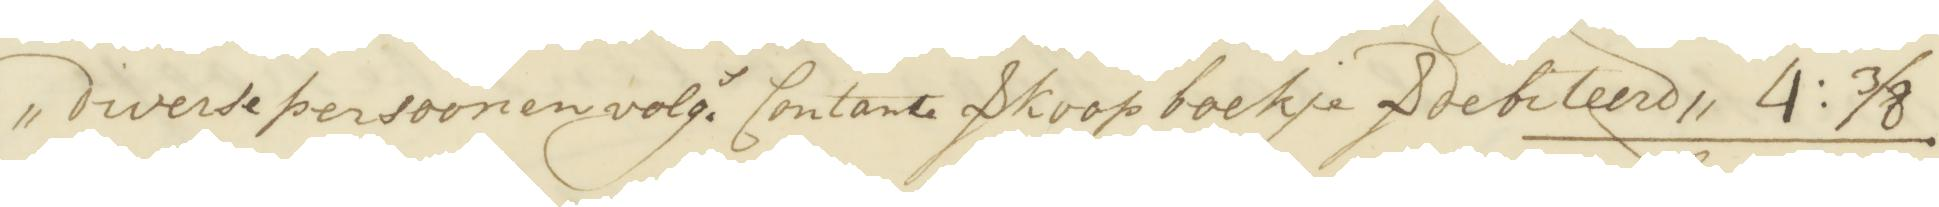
„diverse persoonen volg.s contante verkoop boekje verdebiteerd„ 4:3/8
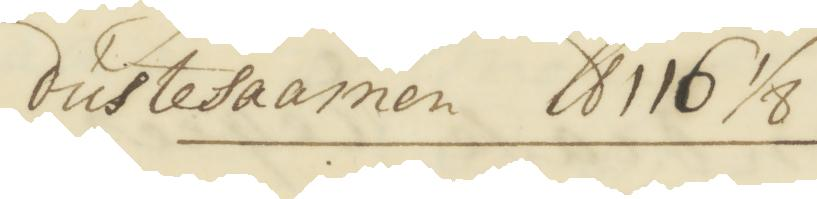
dus tesaamen lb 116 1/8
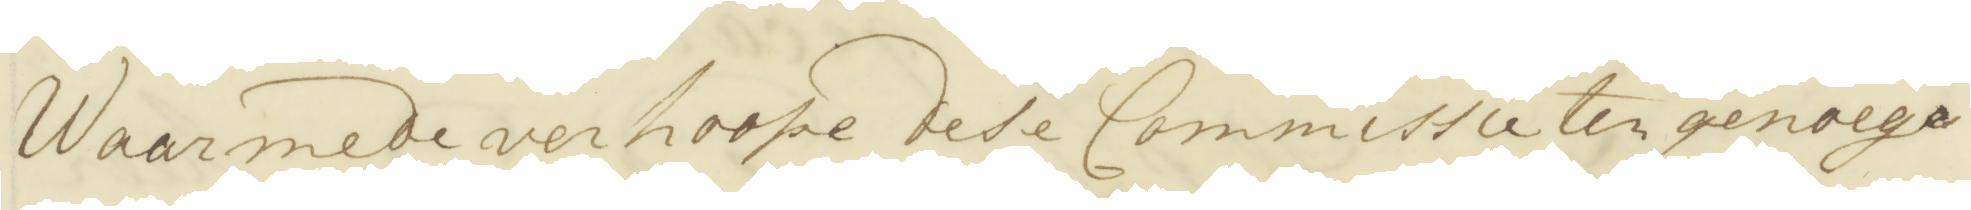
Waarmede verhoope dese Commissie ten genoege
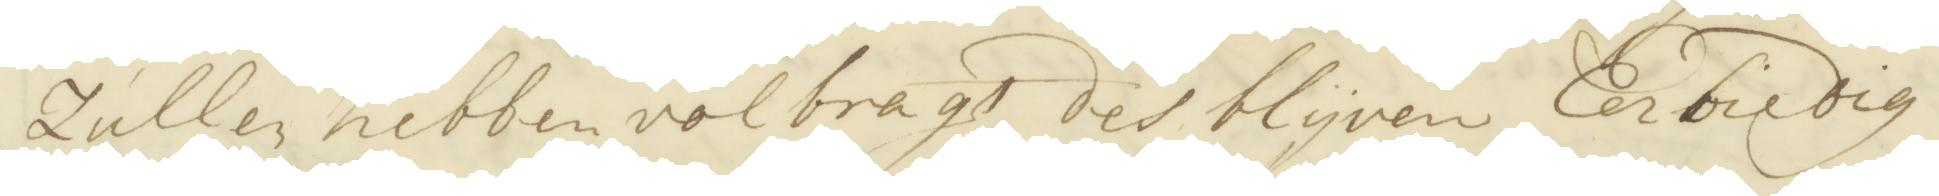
zullen hebben volbragt des blijven Eerbiedig
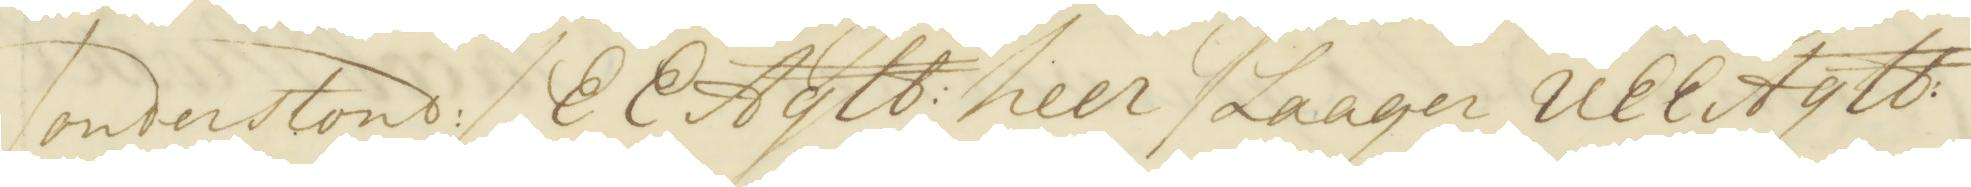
/onderstond:/ E E Agtb: heer Laager UE E Agtb:
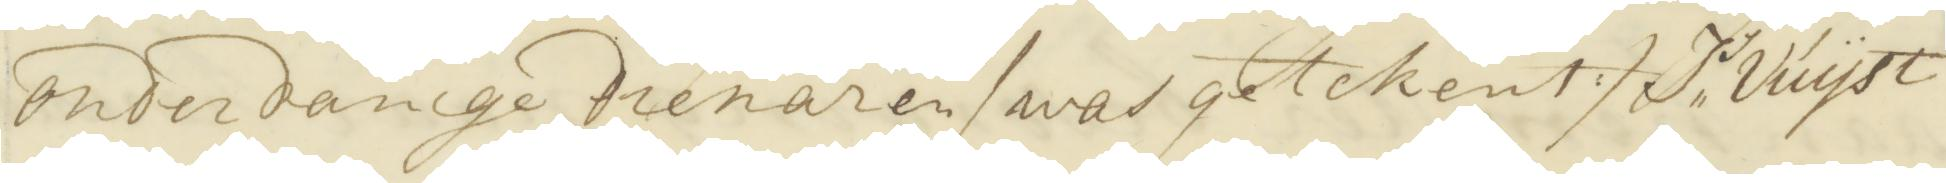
onderdanige dienaren /was getekent:/ I„s Vuijst
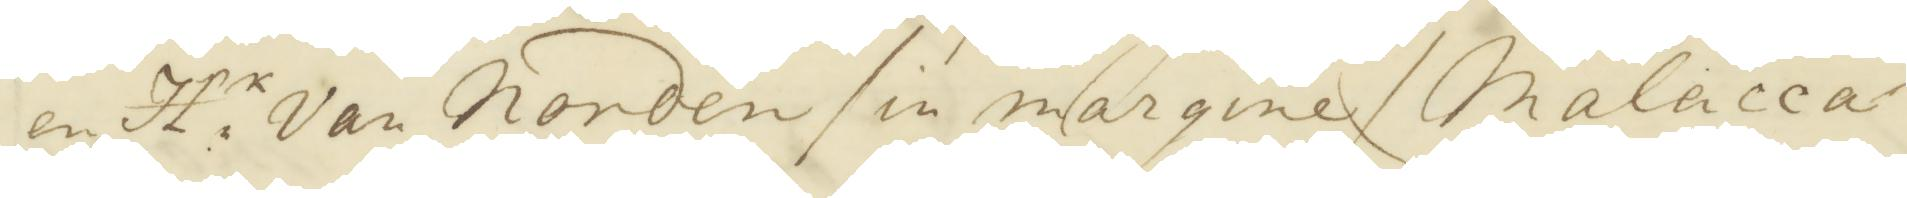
en H:k van norden /in margine/ Malacca
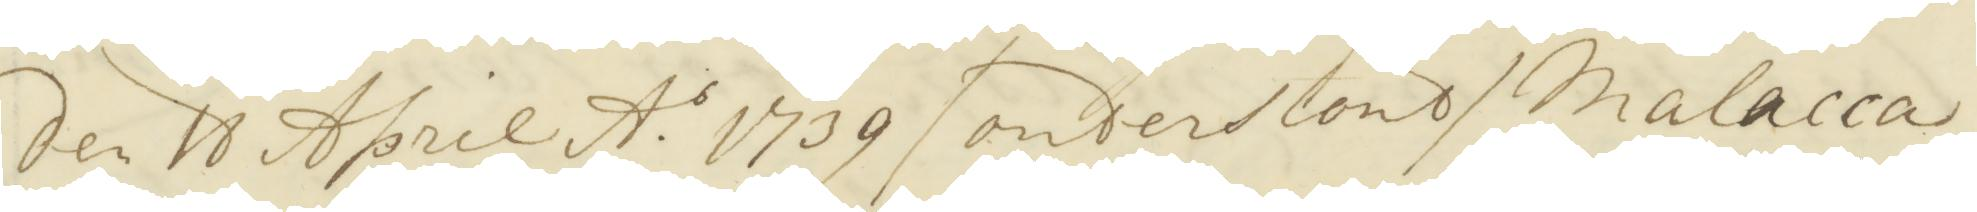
den 18 April A.o 1739 /onderstond/ Malacca
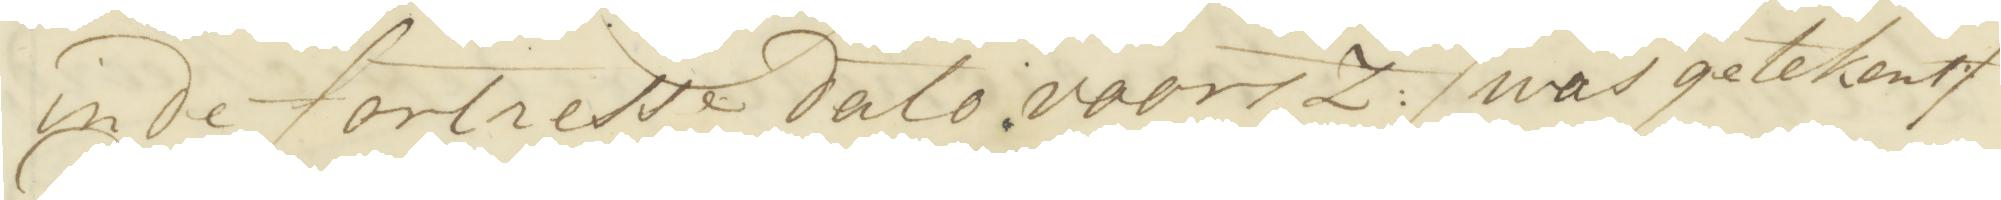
in de fortresse dato voorsz: /was getekent/
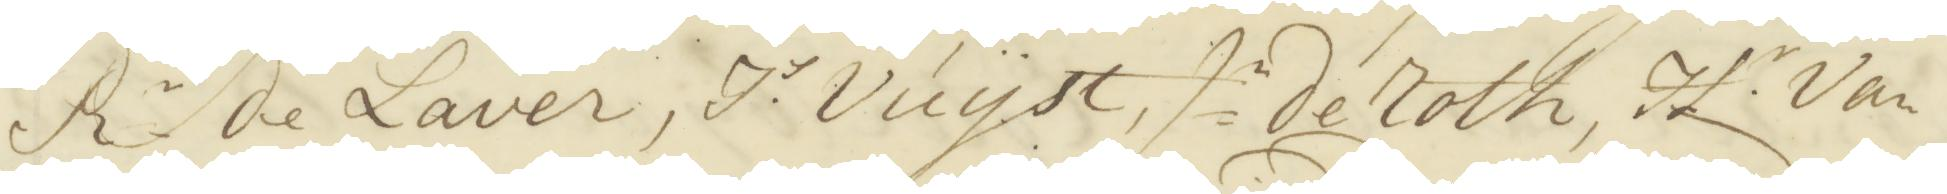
R.r de Laver, I.s Vuijst, J=n de roth, H.r Van
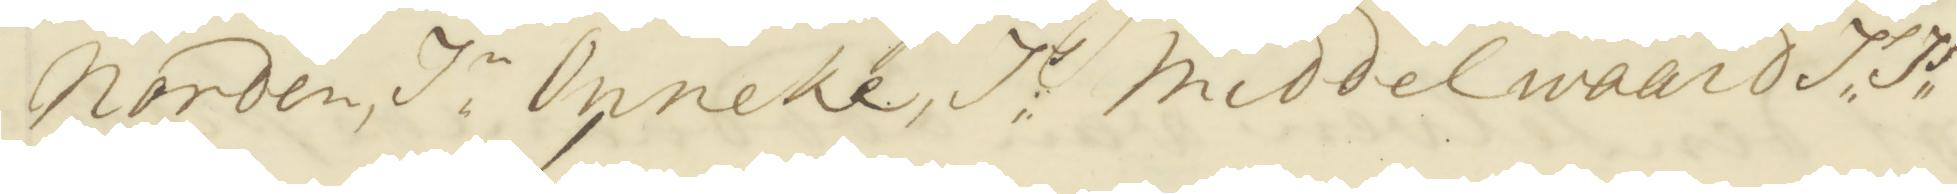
Norden, I„r Onneke, I:s middelwaard I„s I„s
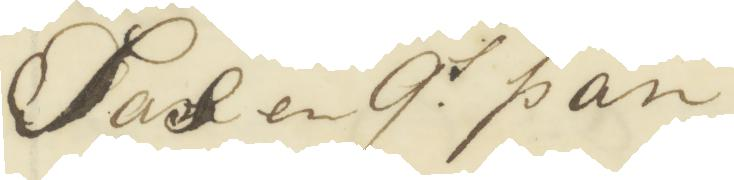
Pas en G:s pan
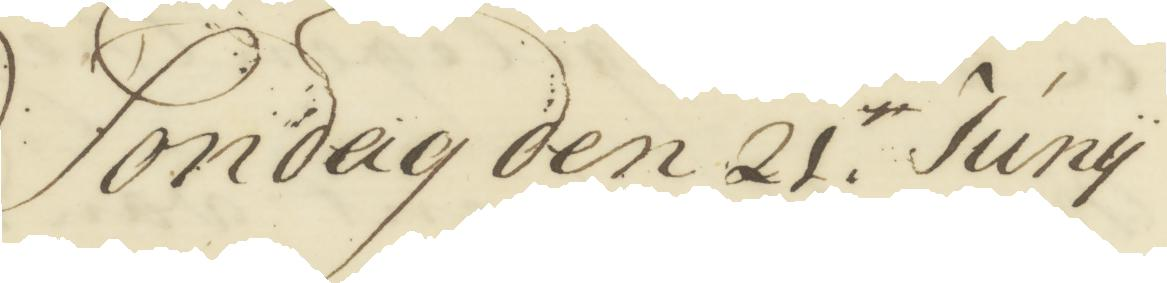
Sondag den 21,te Junij
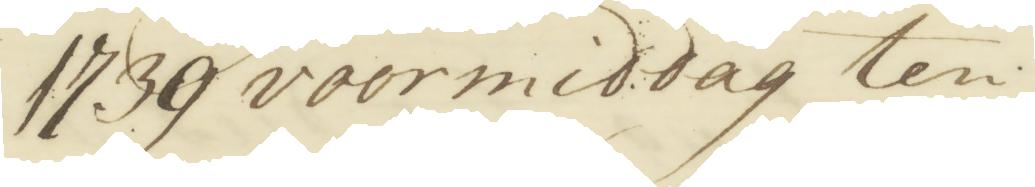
1739 voormiddag ten
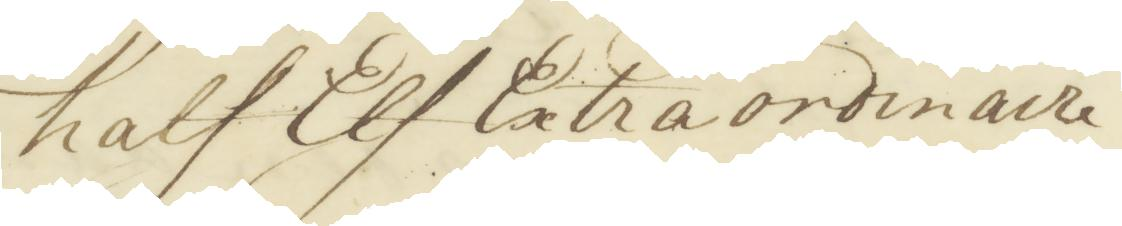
half Elf Extra ordinaire
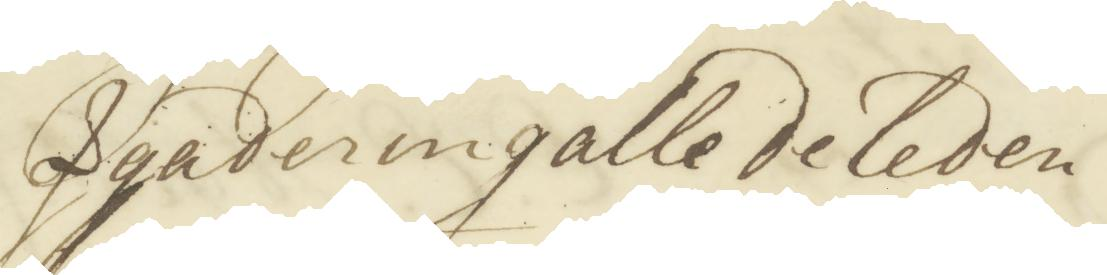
vergadering alle de leden
